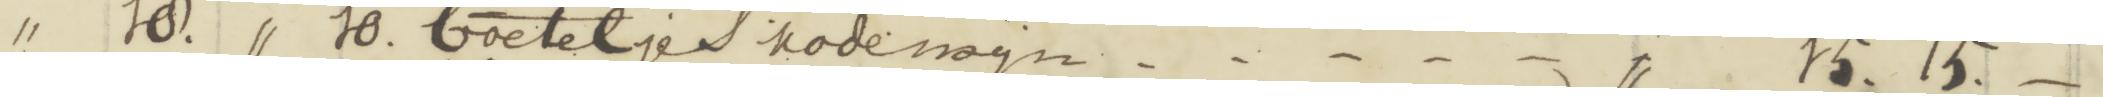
„ 18. „ 18. boeteljes rode wijn - - - - - „ 15. 15. —
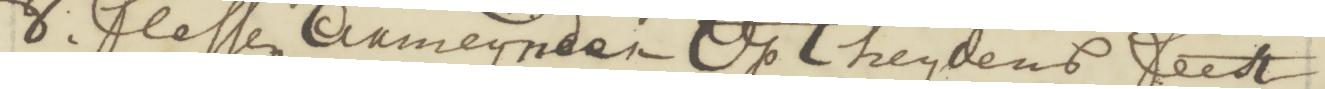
8. flessen armeijnder Op 't heijdens feest
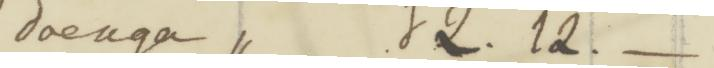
doerga „ 12. 12. —
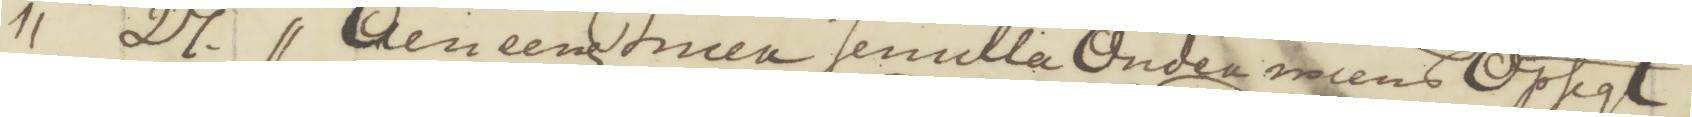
„ 27. „ Aen een Mier Jenulla Onder wiens Opsigt
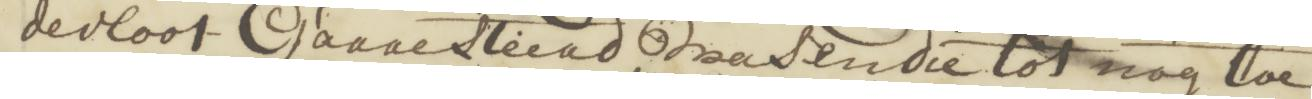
de vloot G'arresteerd was en die tot nog toe
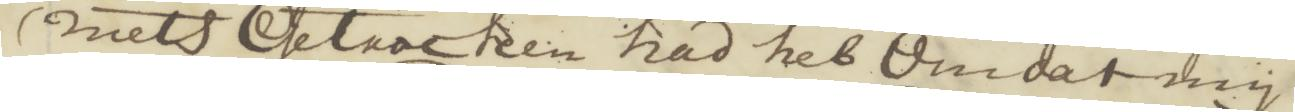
(niets Getrocken had heb Om dat mij
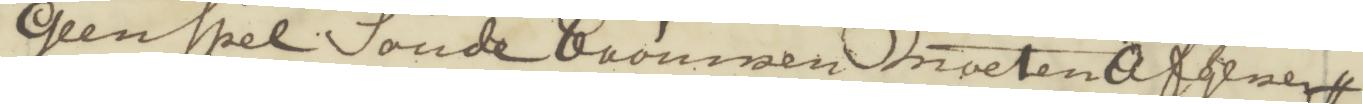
geen spel soude brouwen moeten afgeven „
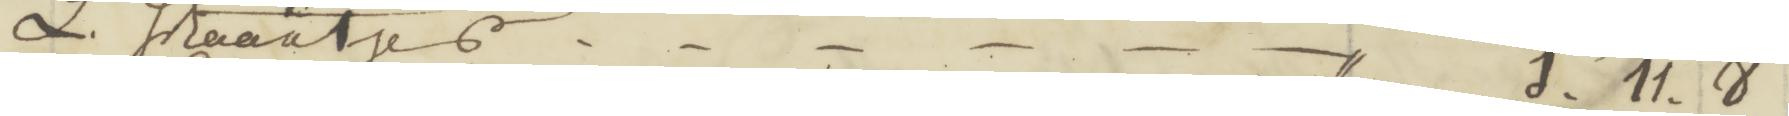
2. schaartjes - - - - - - „ 1. 11. 8
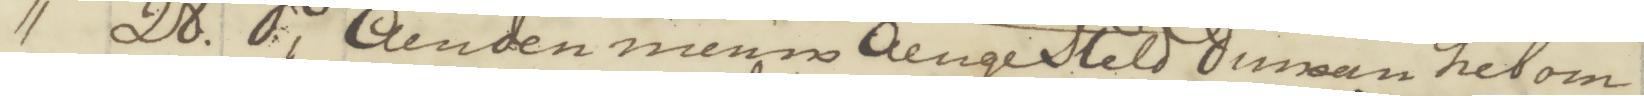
„ 28. d„o Aenden nieuw Aengesteld d'uwan heb om
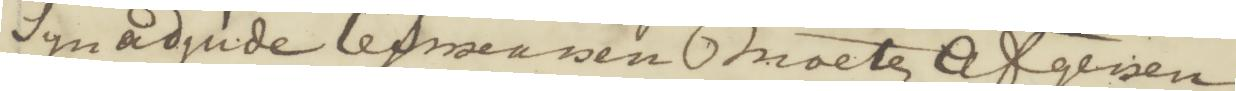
syn adjude teverwerven moeten afgeven
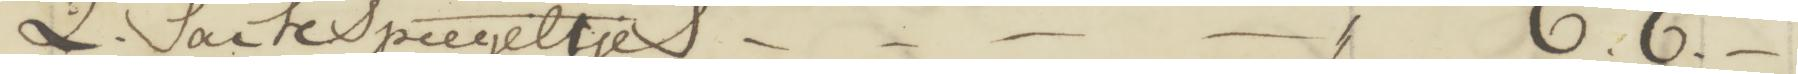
2. sackspiegeltjes - - - - „ 6. 6. —
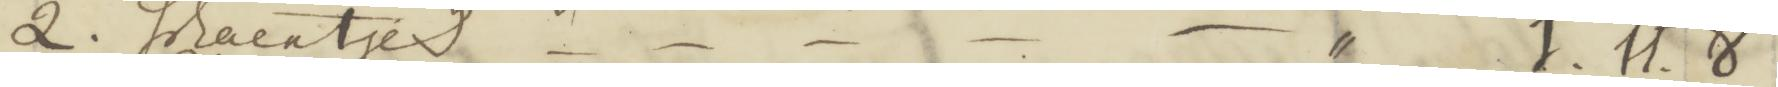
2. schaertjes - - - - - „ 1. 11. 8
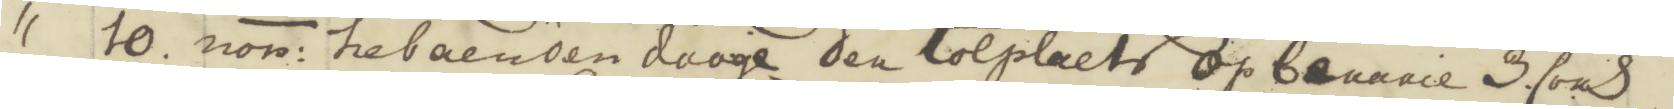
„ 10. nov: heb aenden daage den tolplaets op berarie 3. Cors
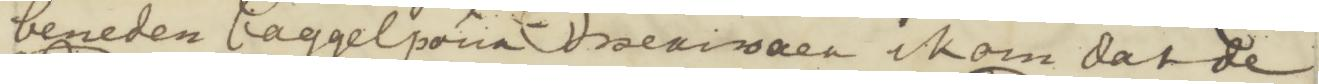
beneden baggelpour werivaer ik om dat de
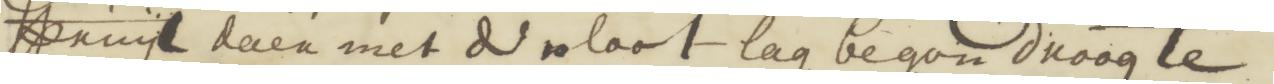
spruijt daer met de vloot lag begon droog te
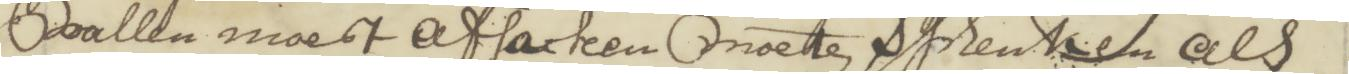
vallen moest afsacken moeten verschenken als
